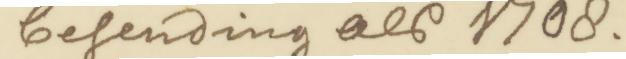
besending als 1708.
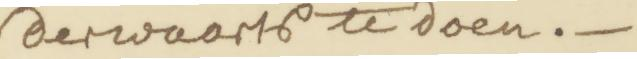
derwaarts te doen. —
